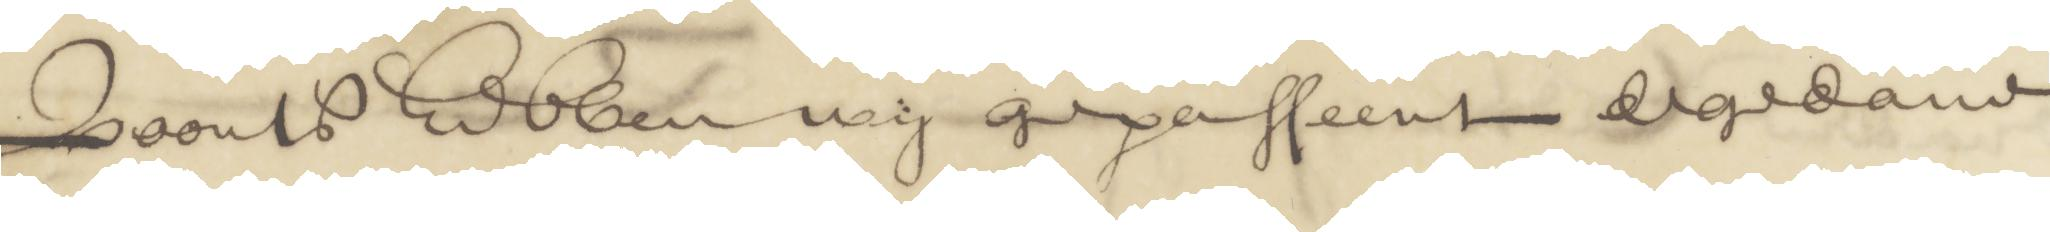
Voorts hebben wij gepasseert de gedane
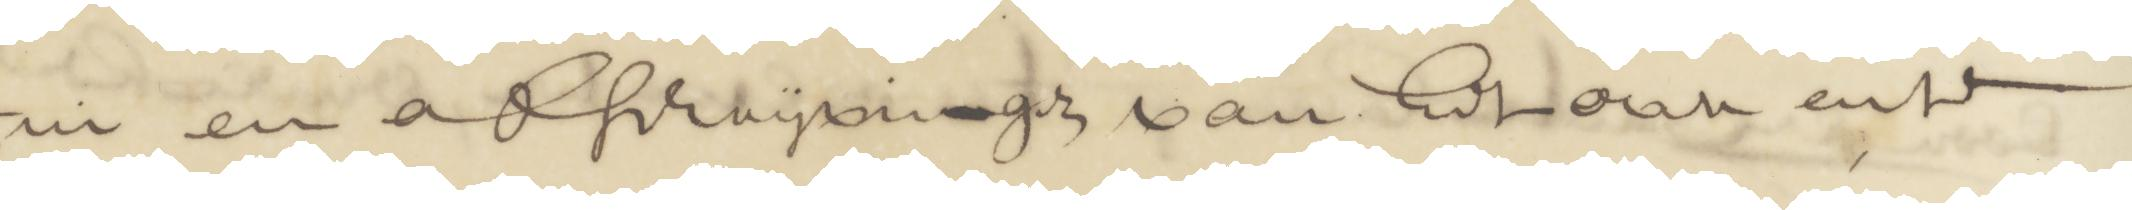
in en afschrijvingen van het over en te
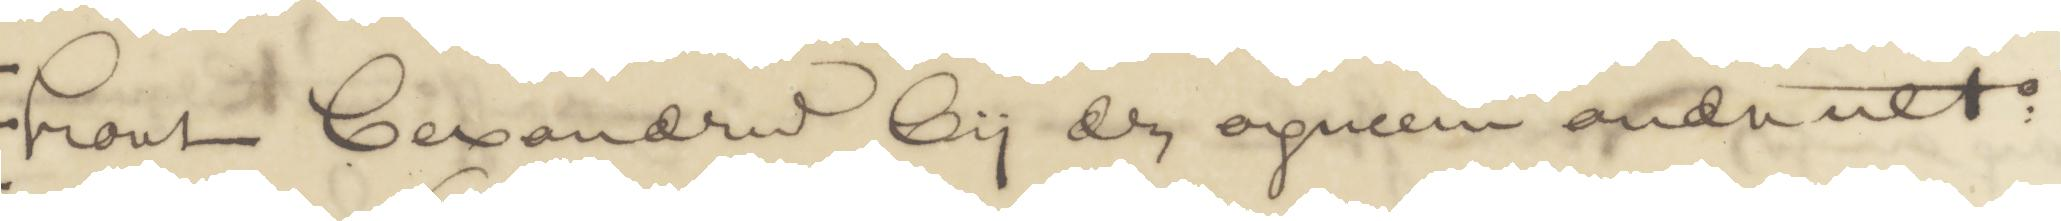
kort bevondene bij den opneem ondr ult:o
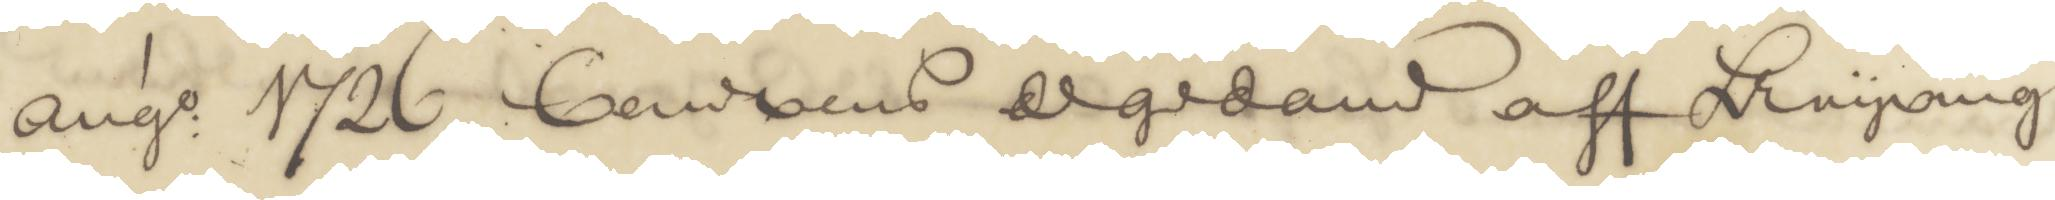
Aug:o 1726 benevens de gedane aff schrijving
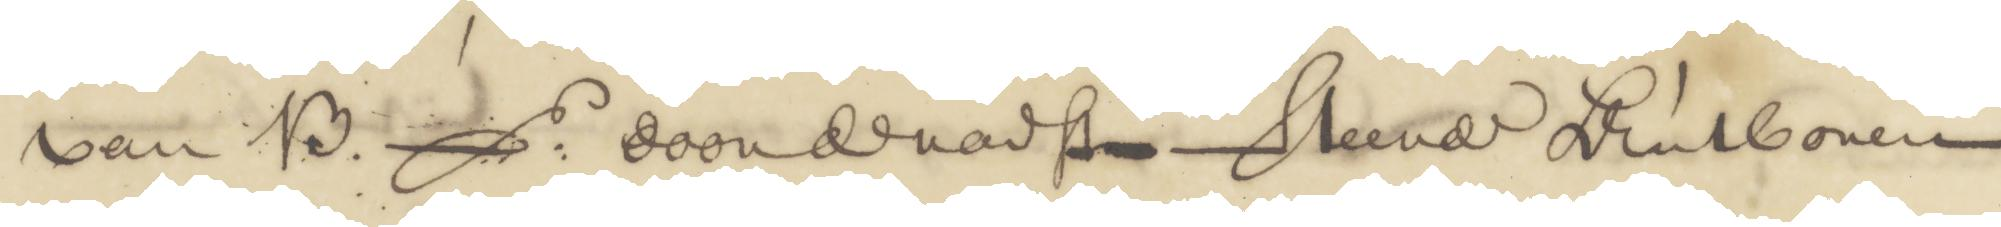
van 13. p:s door de roest verteerde schutboren
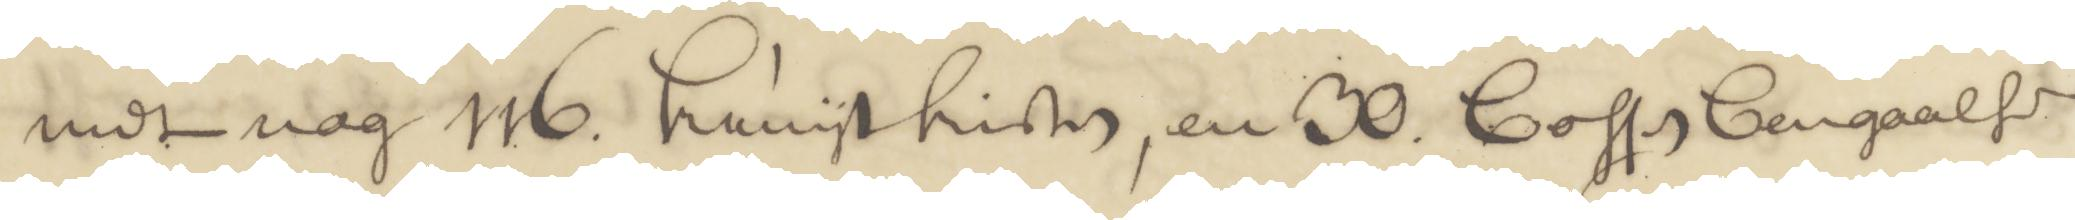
met nog 116. kruijtkisten, en 30. Bossen Bengaalse
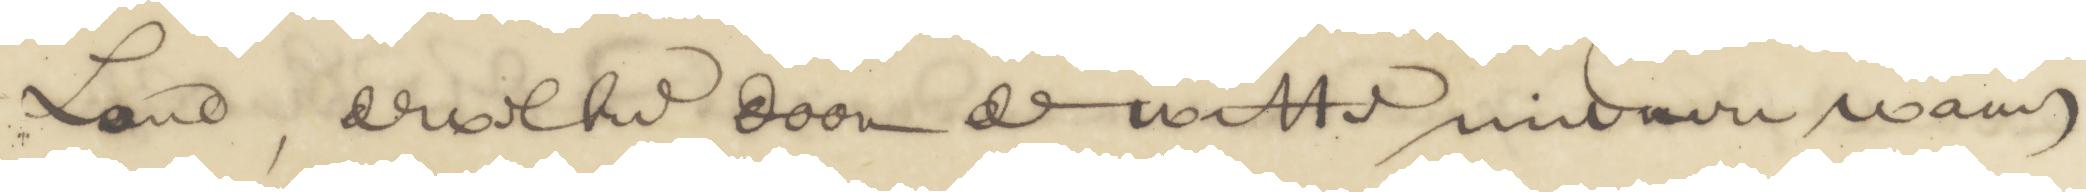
Lond, dewelke door de witte mieren waren
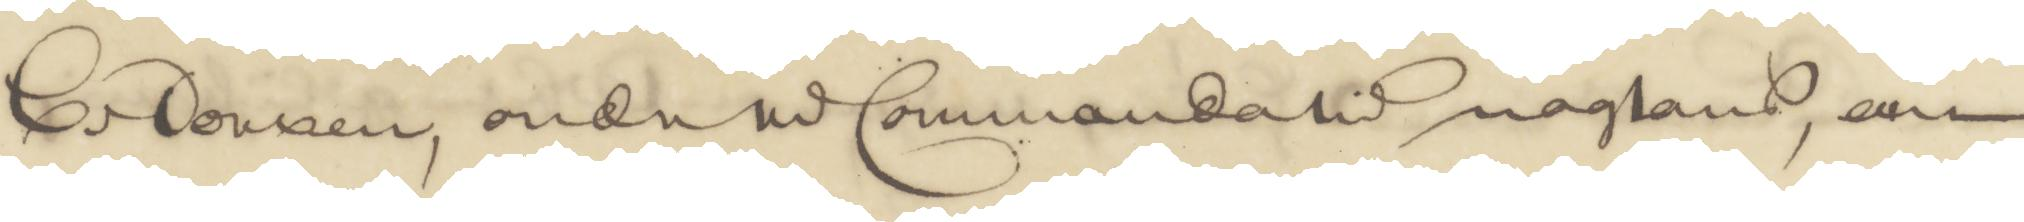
Bedorven, onder recommandatie nogtans, een
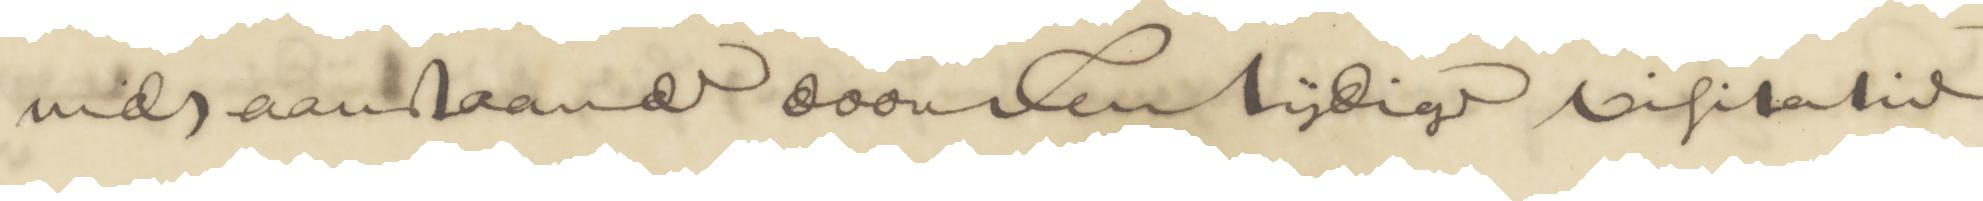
inden aanstaande door Een tijdige visitatie
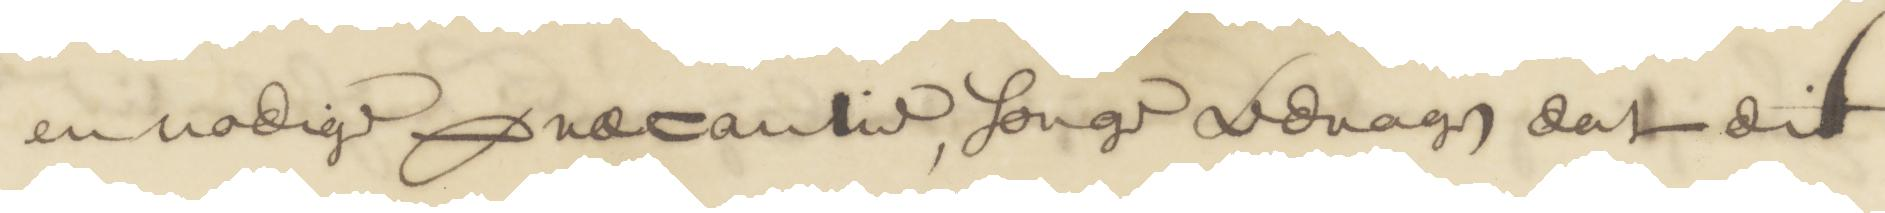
en nodige precautie, sorge tedragen dat dit
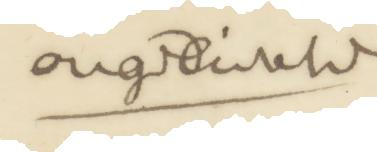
ongedierte
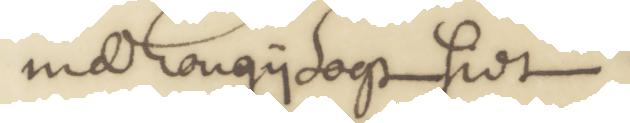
inde hongij loge siet
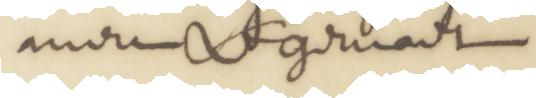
men vergenaet
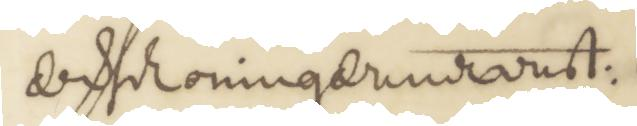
de verschoning der nevenst:
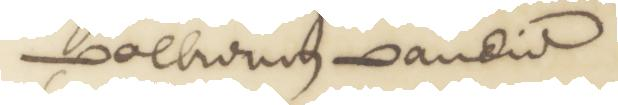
volkeren van die
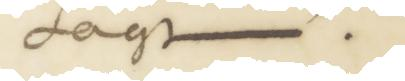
logt.
